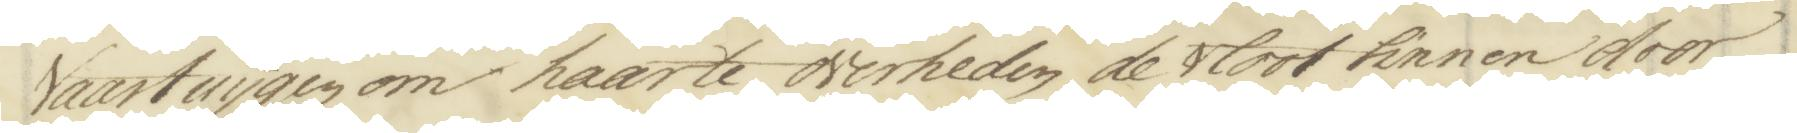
Vaartuijgen om haar te overheden de vloot binnen door
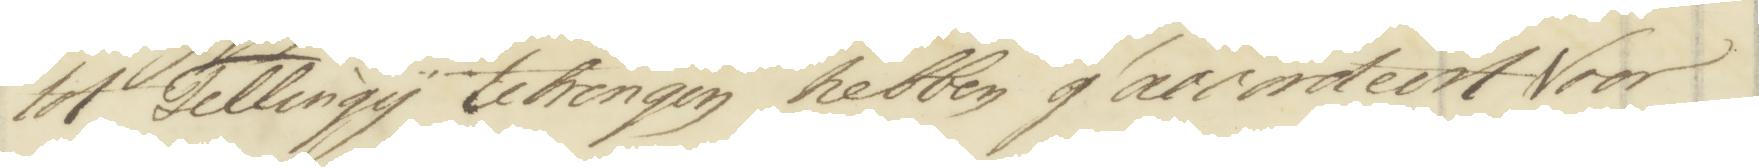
tot Tellingij te brengen hebben g’accordeert Voor
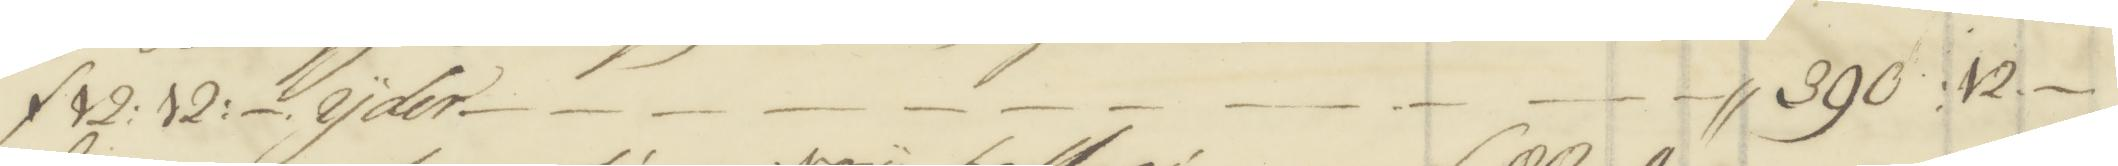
ƒ12:12:—: ijder - - - - - - - - - - - - -„ 390:12.—
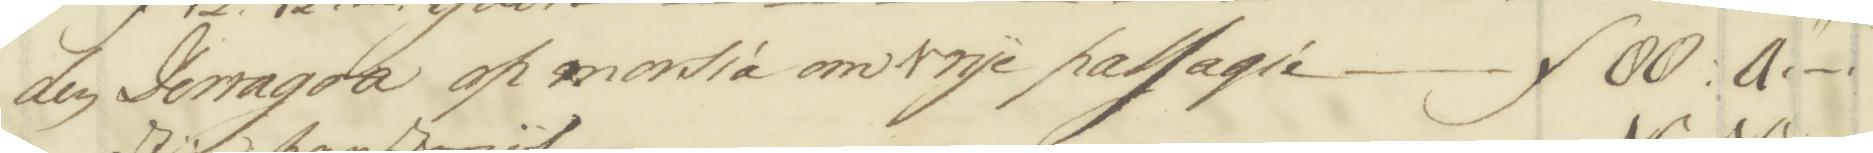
den Derragoa op morsia om vrije passagie - - - ƒ88:4.—.
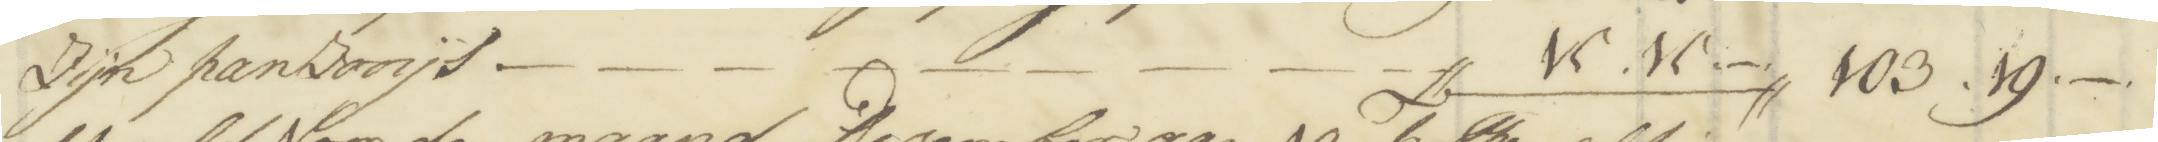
Zijn panzooijs - - - - - - - - - - „ 15.15:—. „ 103.19.—.
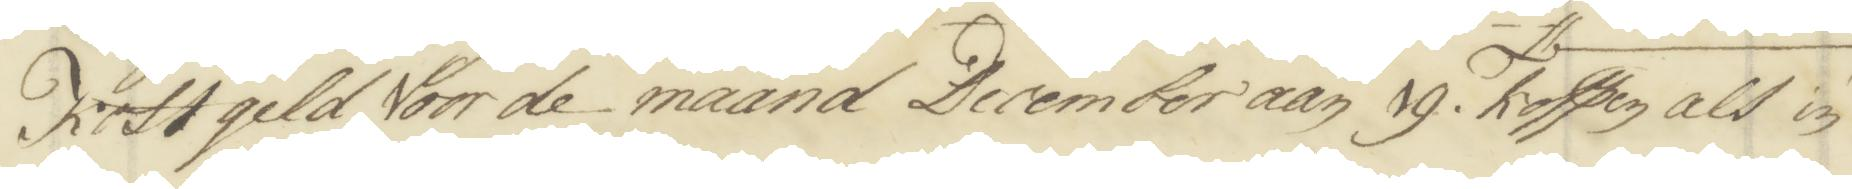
Kost geld voor de maand December aan 19. koppen als in
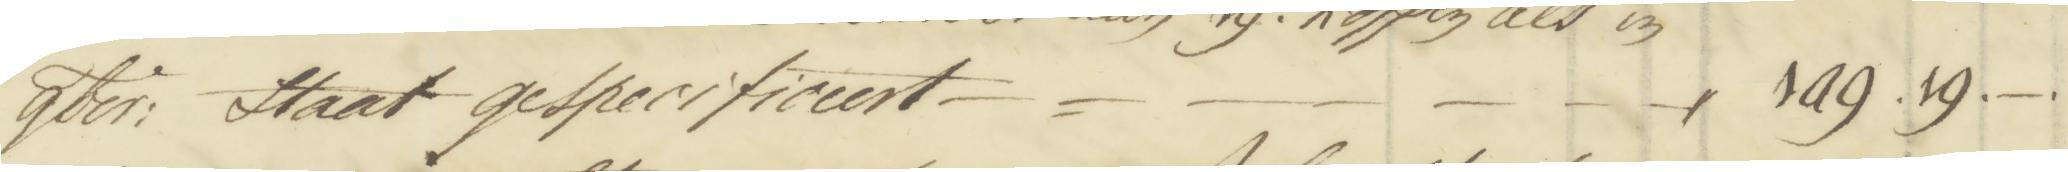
gber: staat gespecificeert - - - - - - - „ 149.19.—.
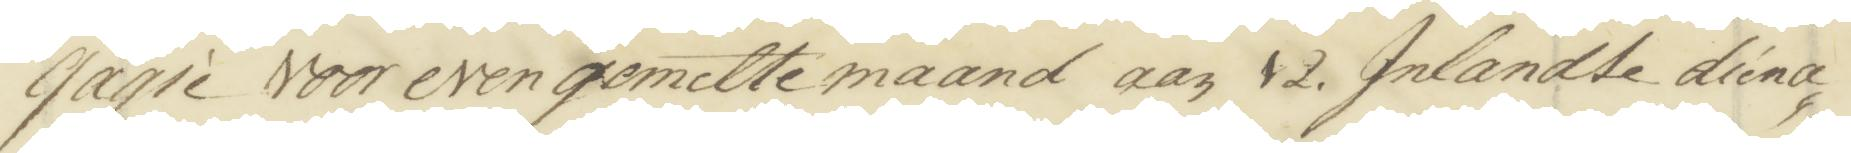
gagie voor even gemelte maand aan 12. Jnlandse diena„
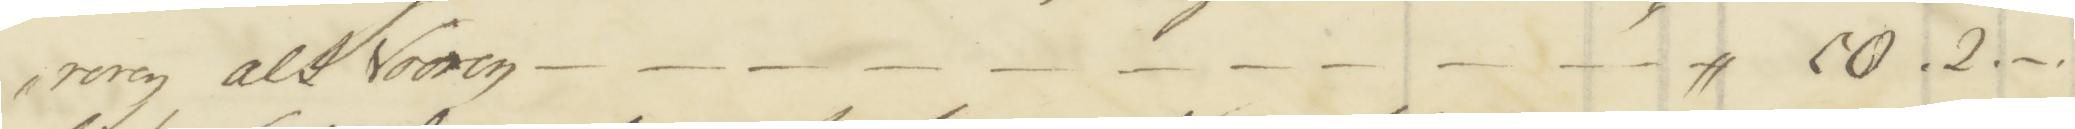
„reren, als Vooren - - - - - - - - - - - „ 58.2.—.
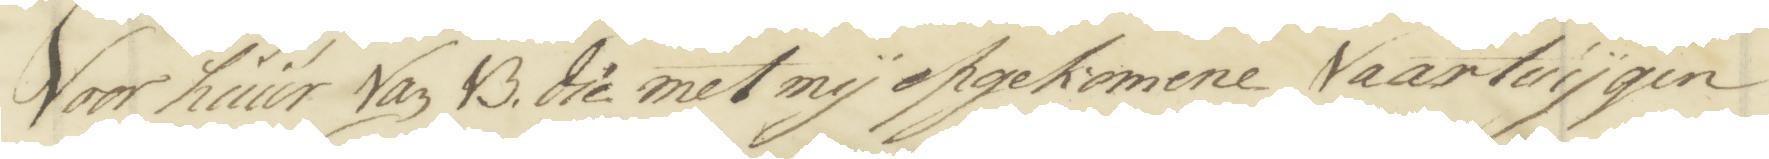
Voor huur Van 13. die met mij opgekomene Vaartuijgen
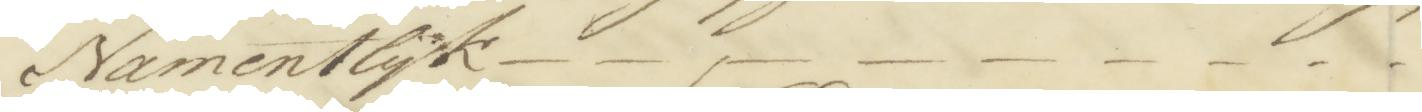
Namentlijk - - - - - - - - -
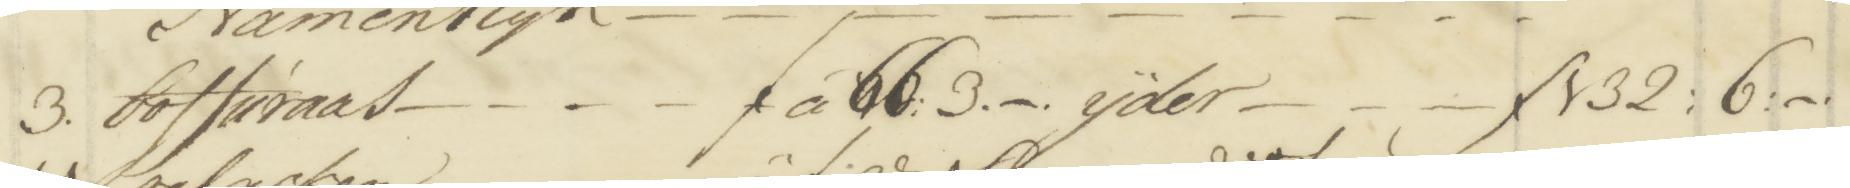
3. bossuvaas - - - - - ƒ â 66:3.—. ijder - - - - ƒ132:6:—.
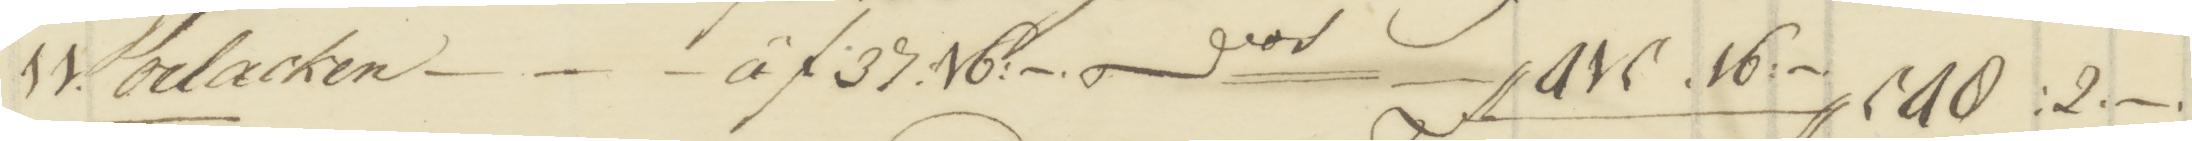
11. oelacken - - -â ƒ 37:16:— D=os „ 415.16:—. „ 548:2.—.
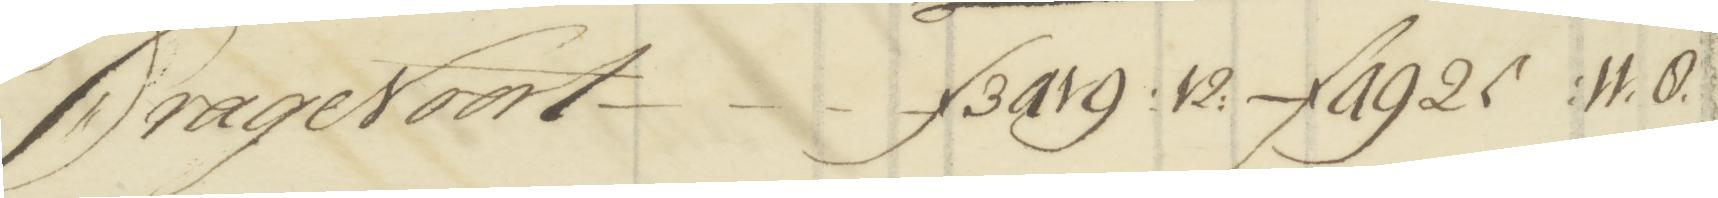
Dragevoort - - - - ƒ3419:12:—ƒ4925:11:8.
